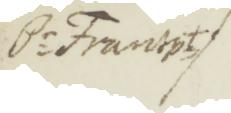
P=r Transp,t ƒ
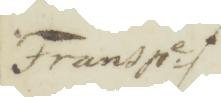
Transp:e ƒ
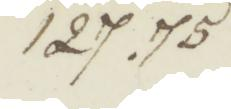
127.75
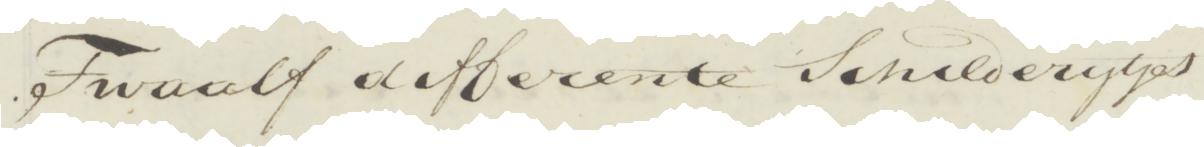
Twaalf differente Schilderytjes
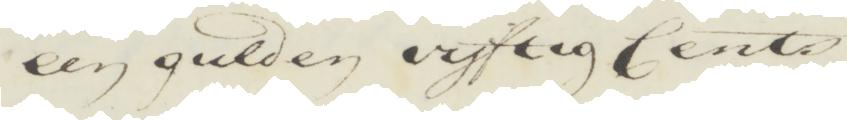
een gulden vyftig Cents
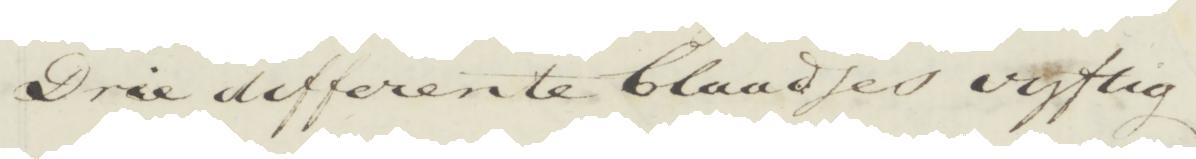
Drie differente blaadjes vyftig
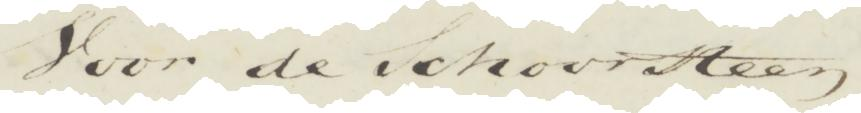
Voor de schoorsteen
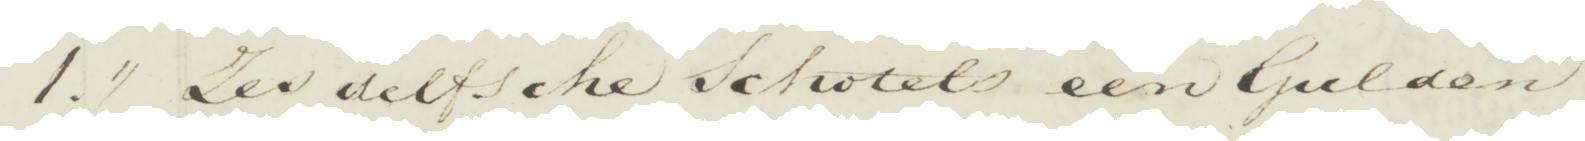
1.„ Zes delfsche schotels een Gulden
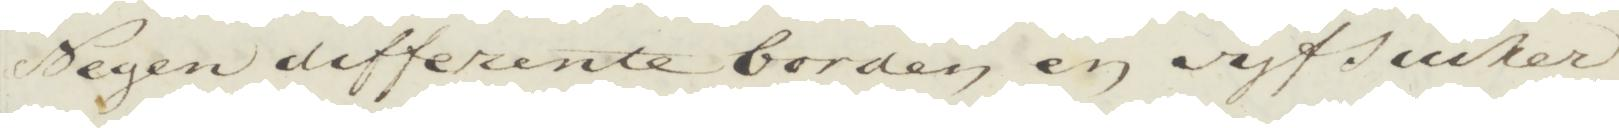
Negen differente borden en vyf suiker
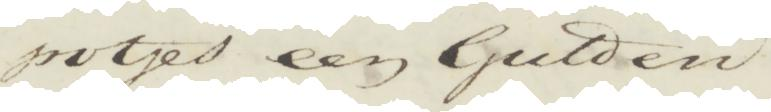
potjes een Gulden
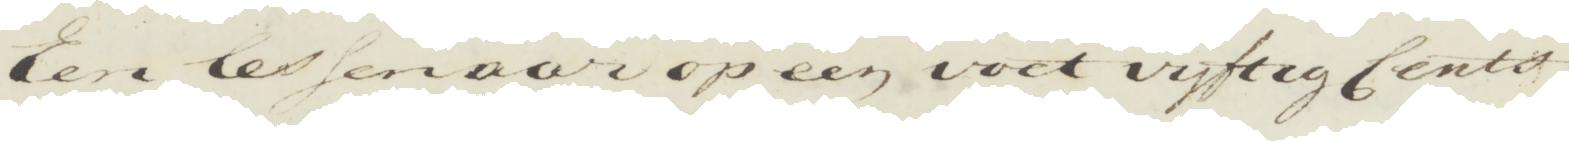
Een lessenaar op een voet vyftig Cents
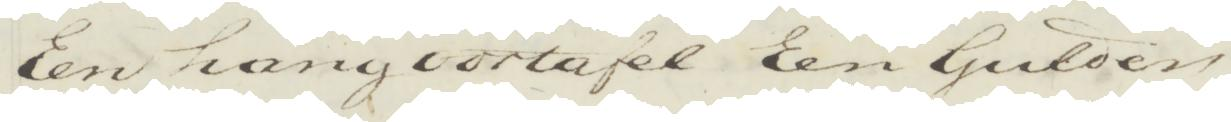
Een hangoortafel Een Gulden
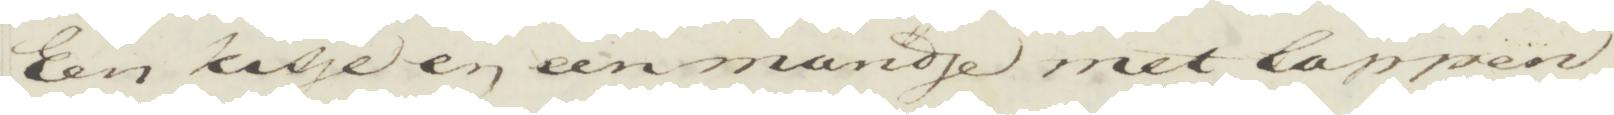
Een kisje en een mandje met Cappen
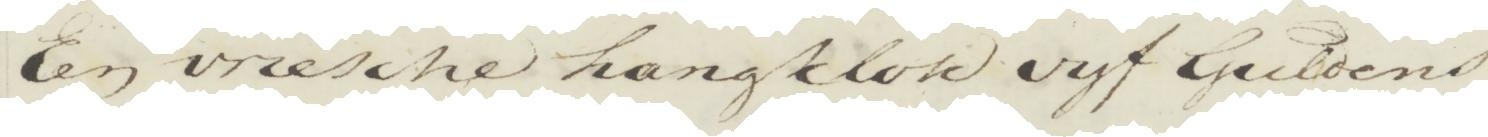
Een vriesche hangklok vyf Guldens
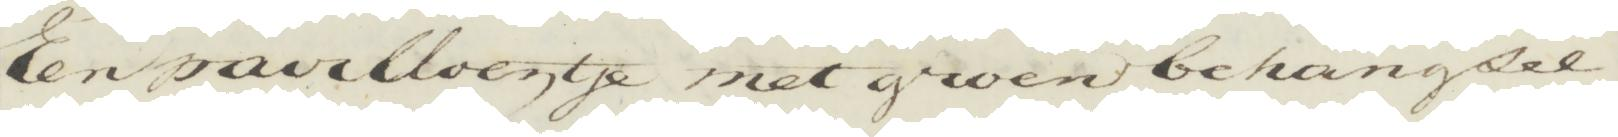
Een pavilloentje met groen behangsel
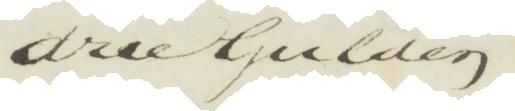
drie Gulden
